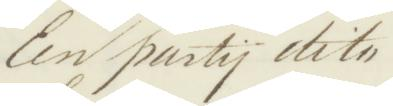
Een partij dito
